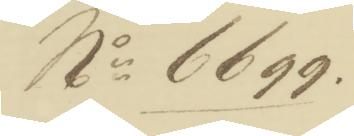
N=o 6699.
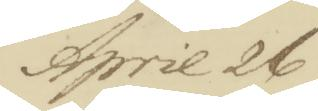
April 26
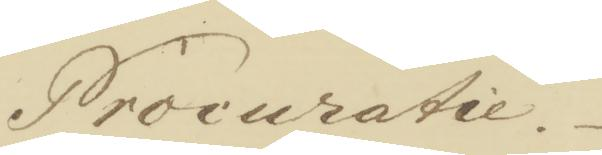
Procuratie. -
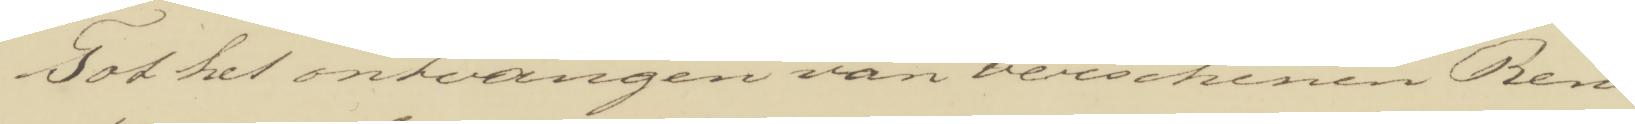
Tot het ontvangen van verschenen Ren
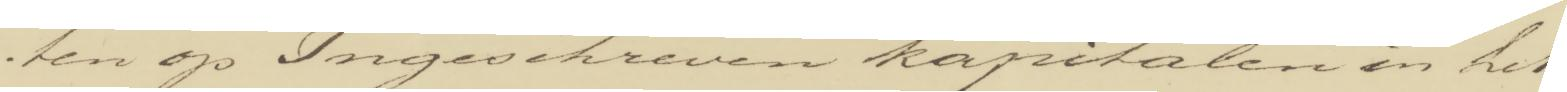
ten op Ingeschreven kapitalen in het
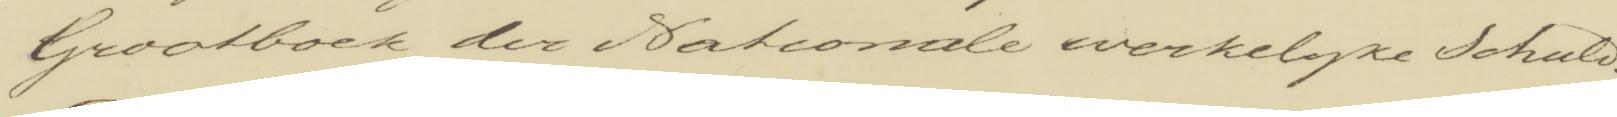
Grootboek der Nationale werkelyke schuld
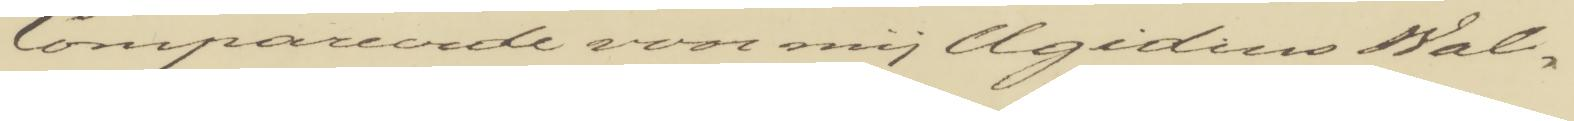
Compareerde voor mij AEgidius Wal„
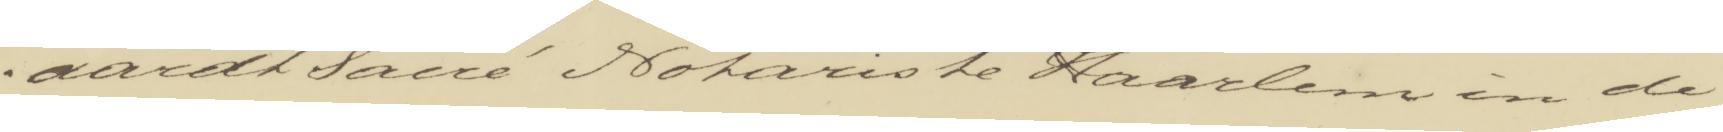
aardt Sacré Notaris te Haarlem in de
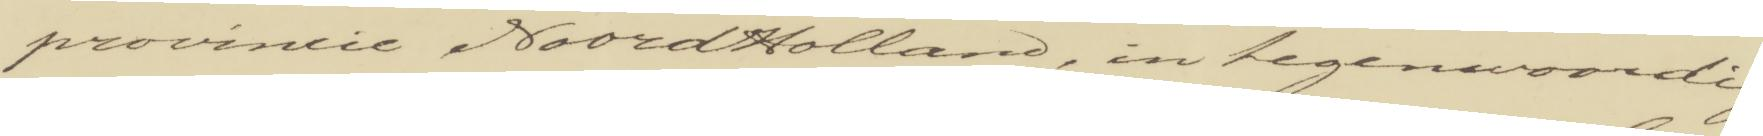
provincie Noord Holland, in tegenwoordig
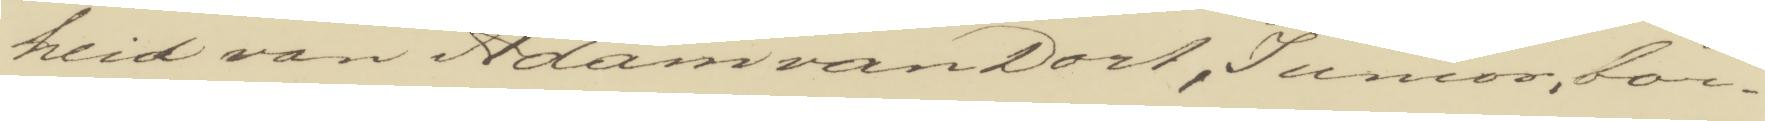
heid van Adam van Dort, Iunior, bor-
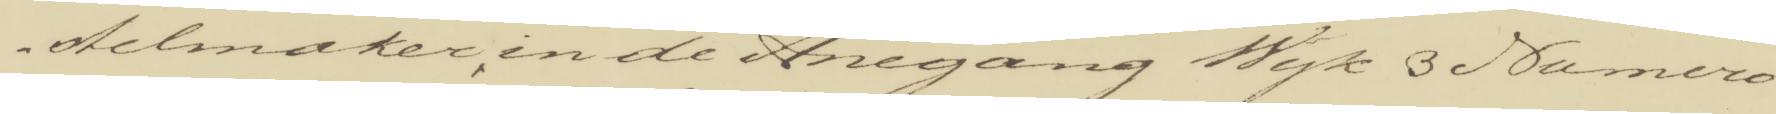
„stelmaker, in de Anegang Wijk 3 Numero
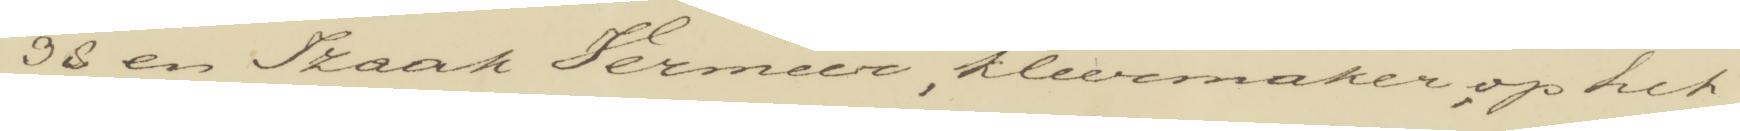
38 en Izaak Vermeer, kleermaker, op het
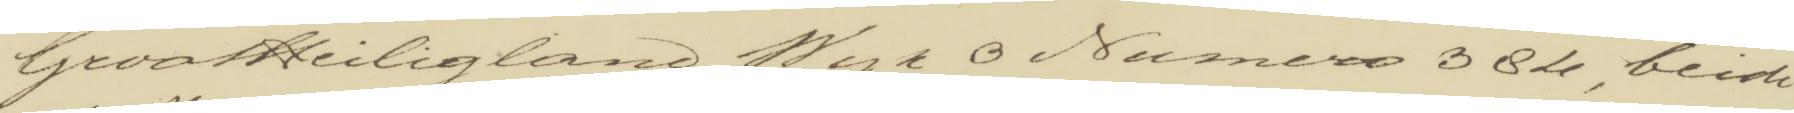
GrootHeiligland, Wyk 3 Numero 384, beide
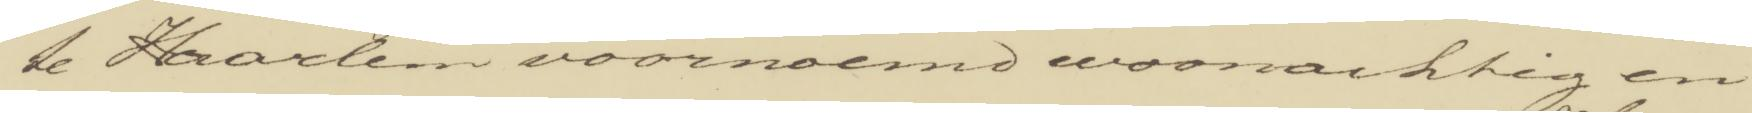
te Haarlem voornoemd woonachtig en
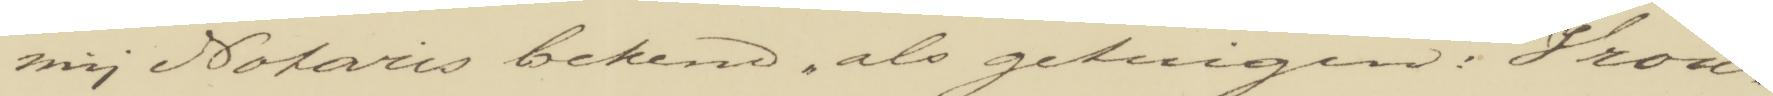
mij Notaris bekend, als getuigen: Vrou„
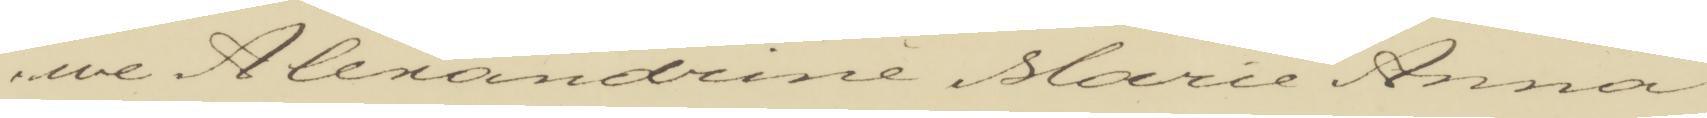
„we Alexandrine Marie Anna
